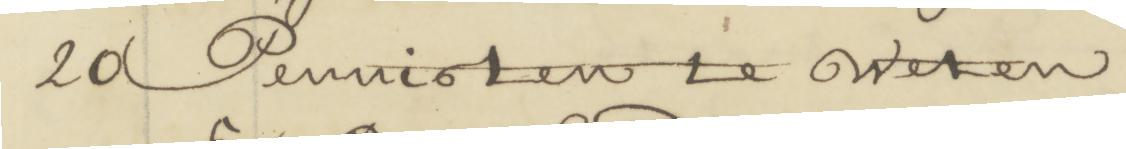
20 Pennisten te weten
